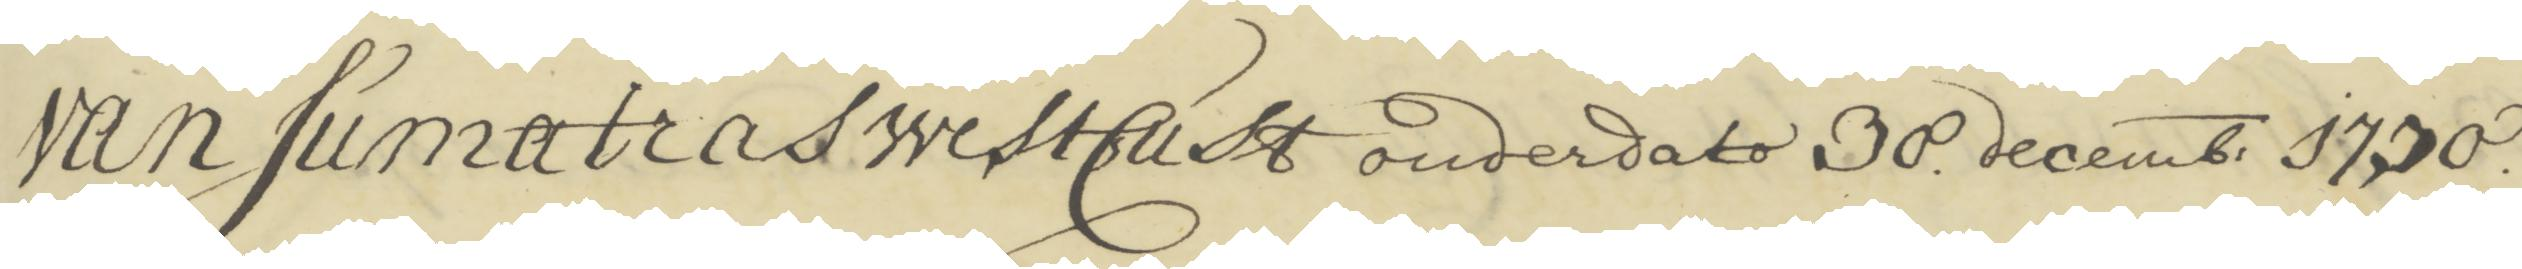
van Sumatras westCust onder dato 38. decemb: 1730.
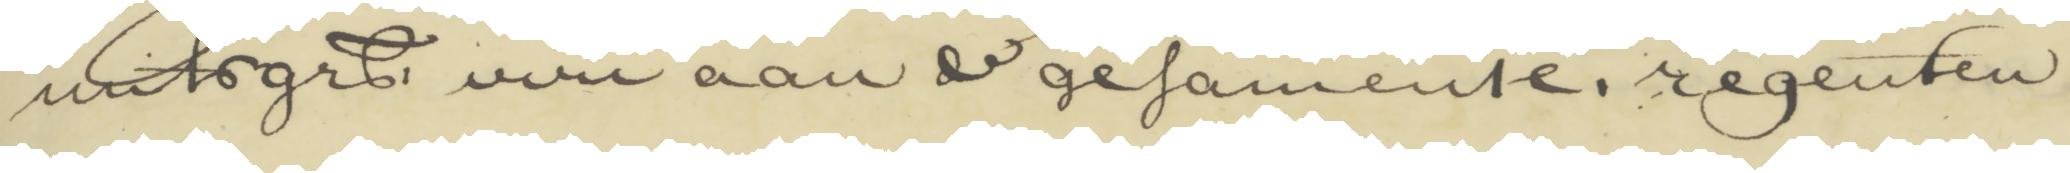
mitsgrs: een aan de gesamentl. regenten
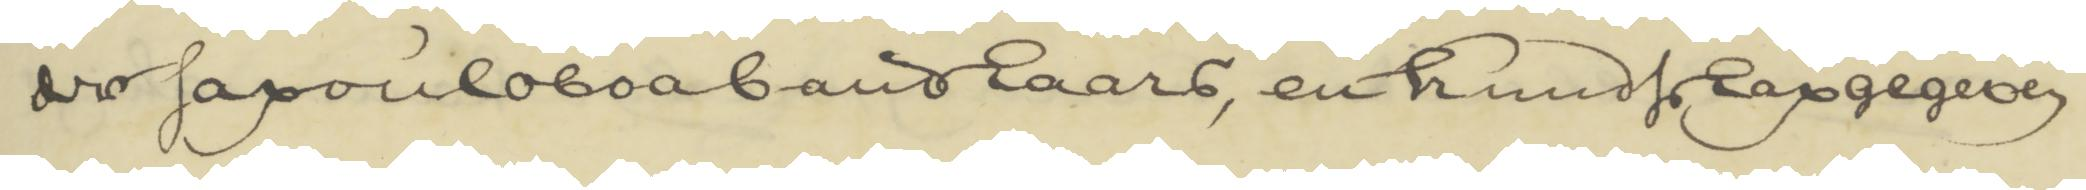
der sapouloboa bandhaars, en kundschap gegeven
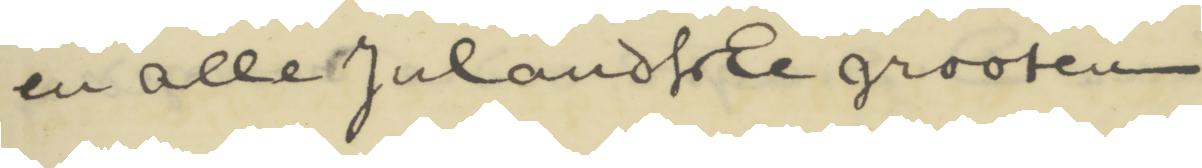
en alle jnlandsche grooten.
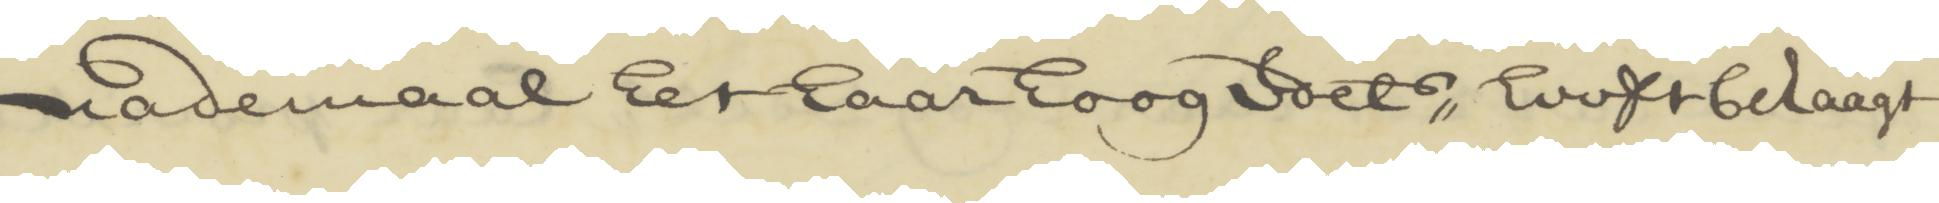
nademaal het haar hoog Edel„s heeft behaagt
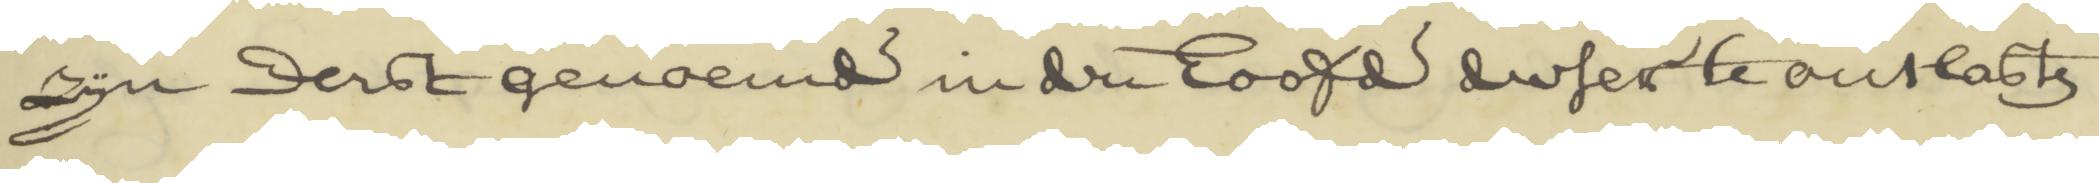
zijn Eerst genoemde in den hoofde deeser te ontlasten
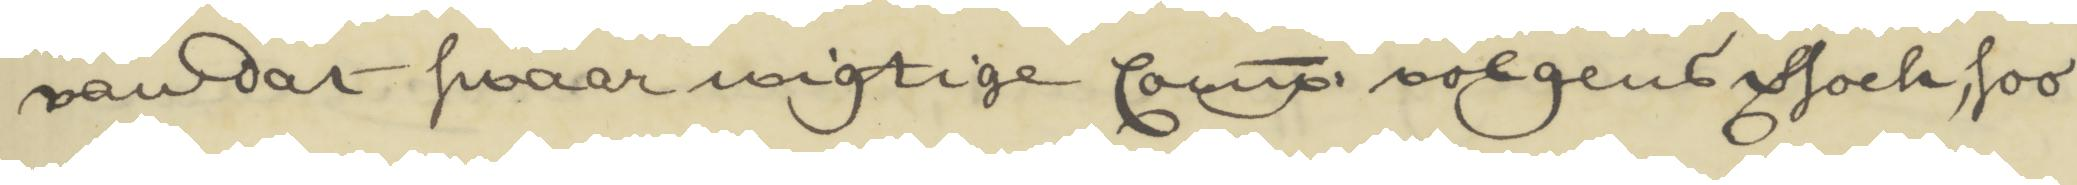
van dat swaar wigtige Comp: volgens versoek, soo
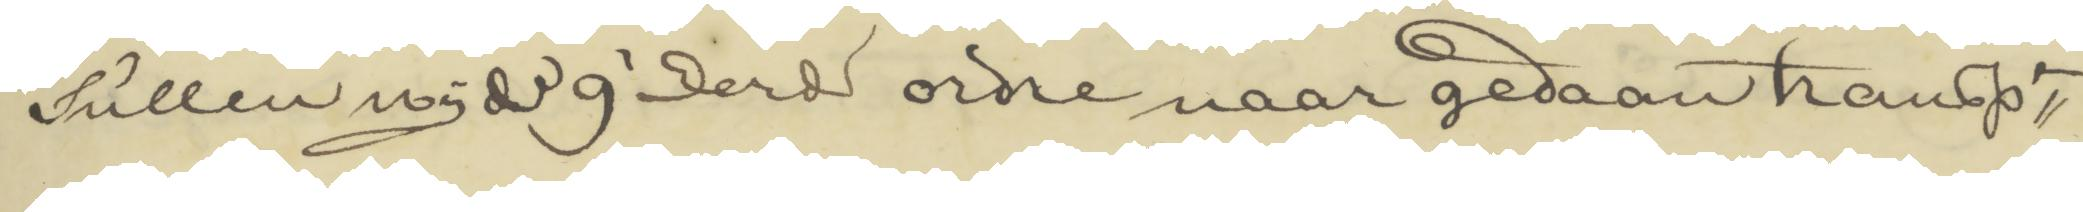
sullen wij de g’Eerde ordre naar gedaan transp„n
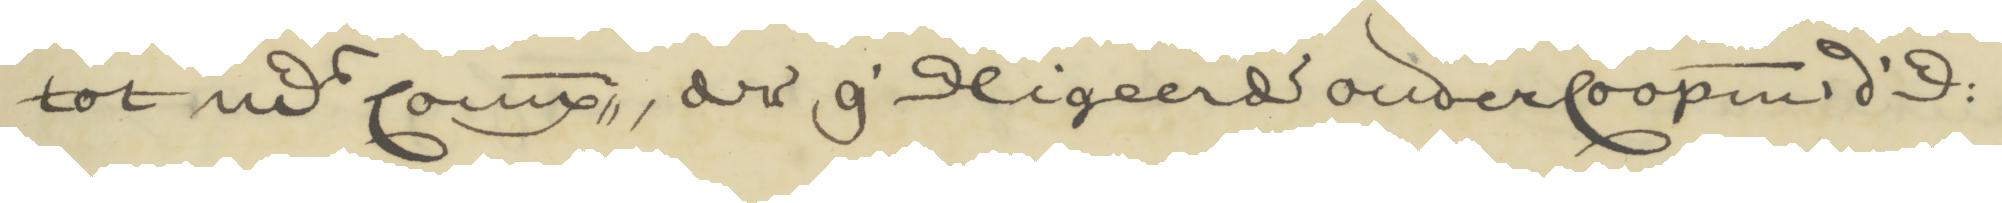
tot uEs Comp„, der g’Eligeerde ondercoopm: d'E:
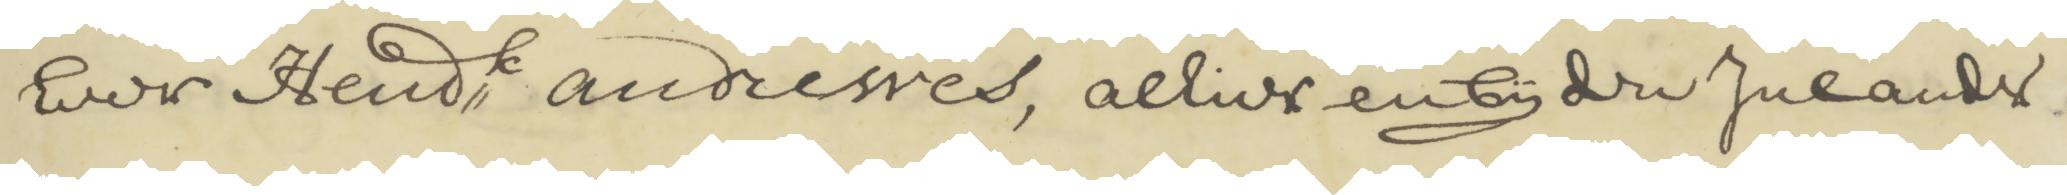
heer Hend„k andrewes, alhier en bij den jnlandse
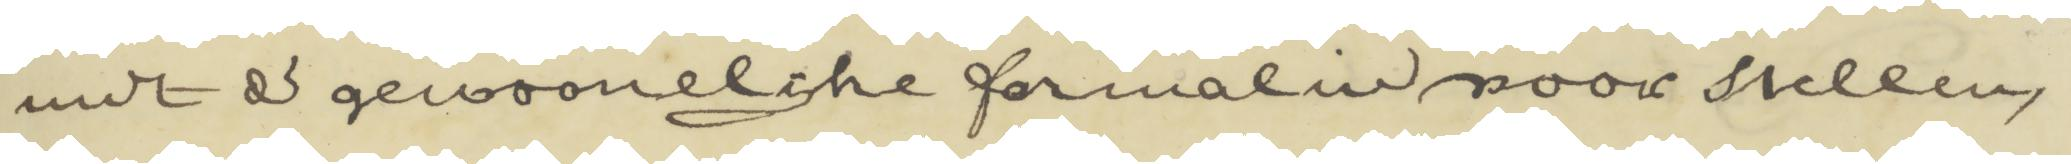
met de gewoonelijke formalie voor stellen,
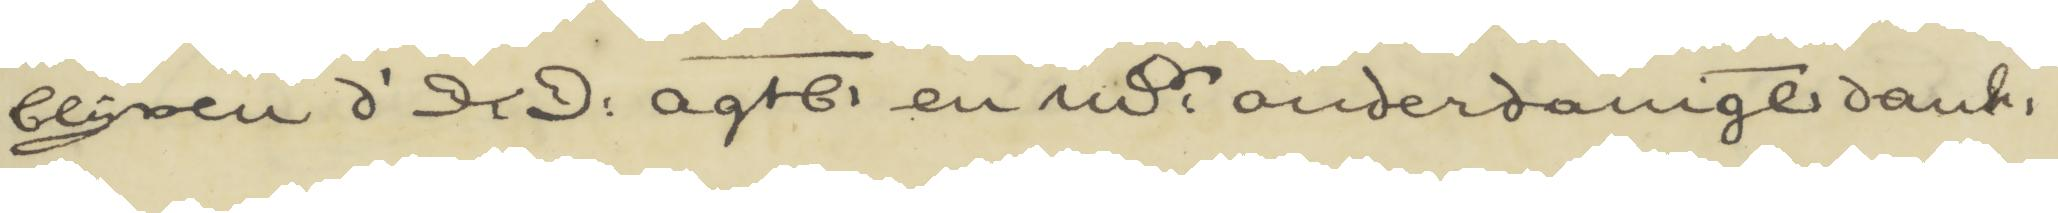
blijven d’ EdE: agtb: en uE: onderdanige dank„
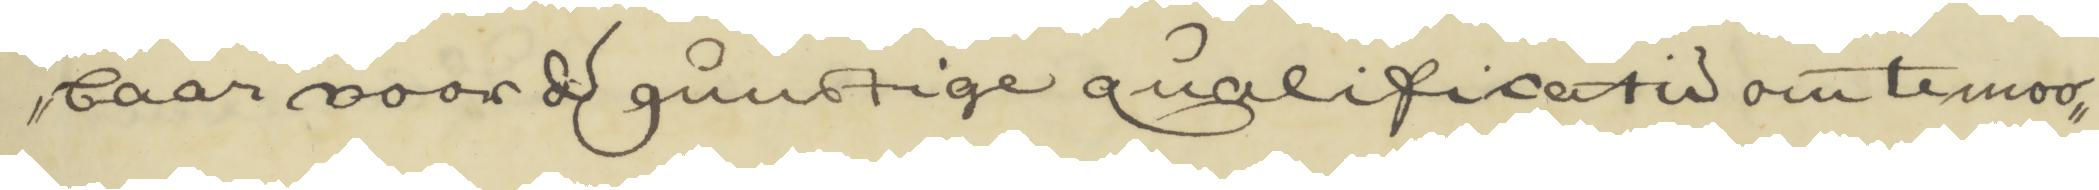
„baar voor de gunstige qualificatie om te moo„
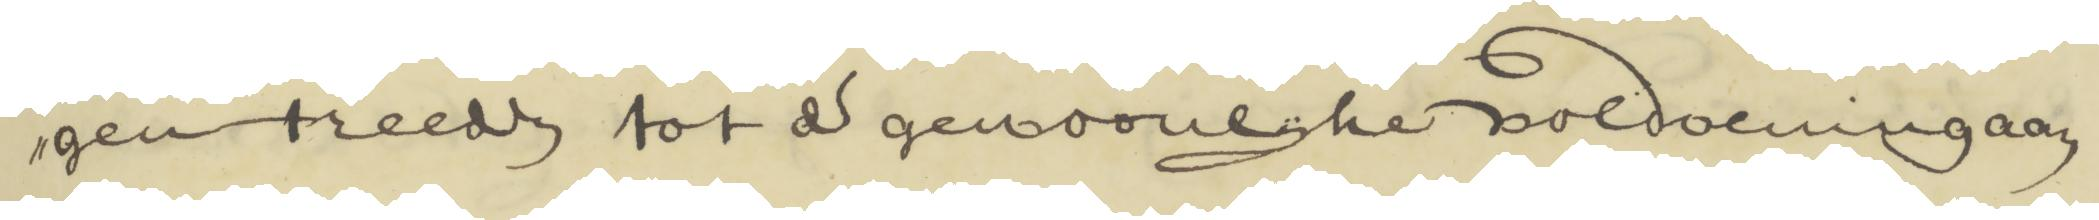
„gen treeden tot de gewoonlijke voldoening aan
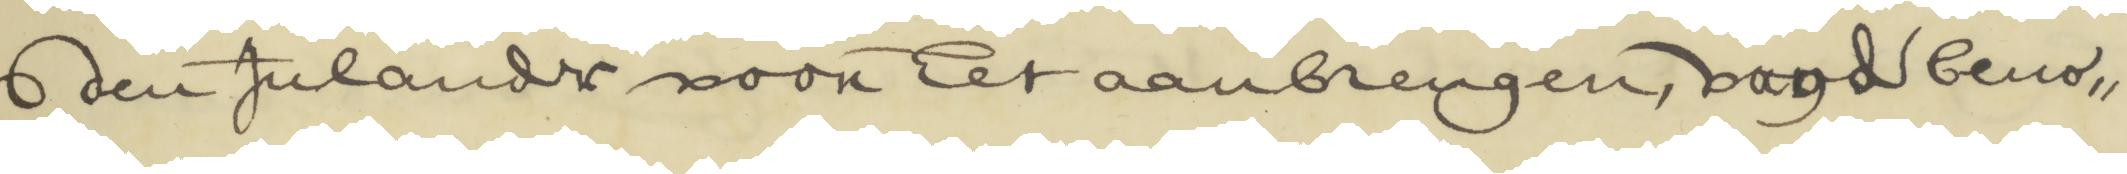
den jnlander voor het aanbrengen, van de beno„
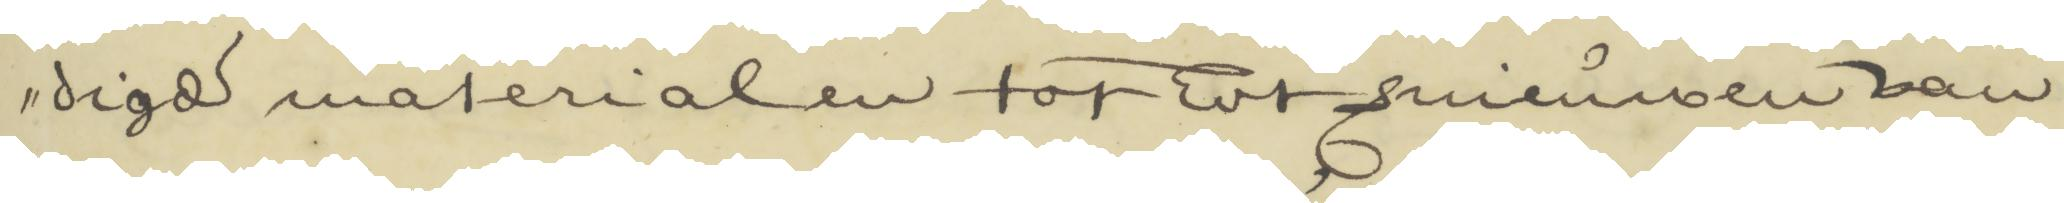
„digde materialen tot het vernieuwen van
